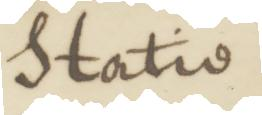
statie
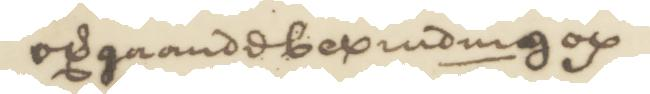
overgaande bevinding op
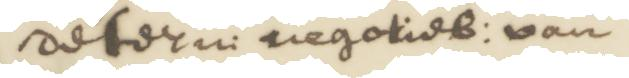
de tern: negotieb: van
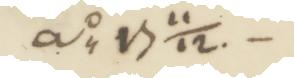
a:o 1711/12 -.
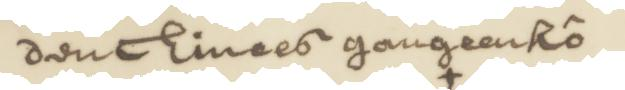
den chinees gangeenkô
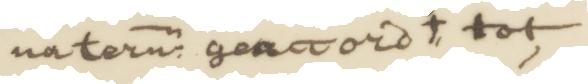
na tern:n geaccord„t tot
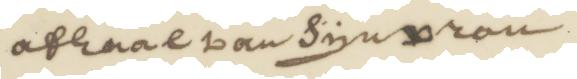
afhaal van sijn vrou
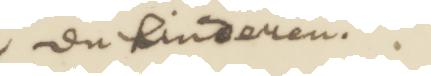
en kinderen.
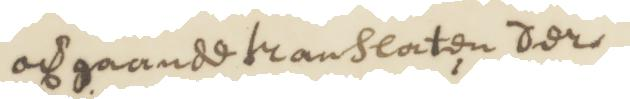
overgaande translaten der
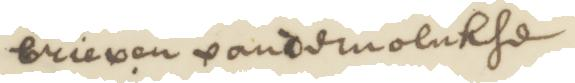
brieven vandemolukse
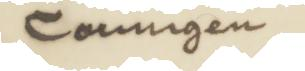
Coningen
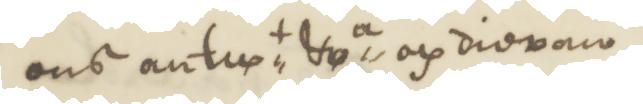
ons antw„t ver„a op die van
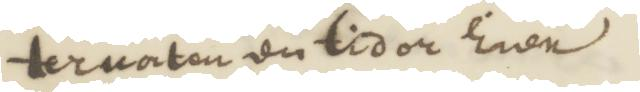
Ternaten en Tidor hier
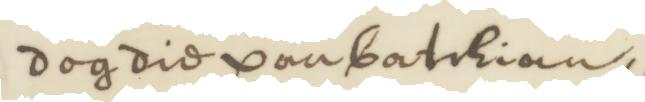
dog die van batchian
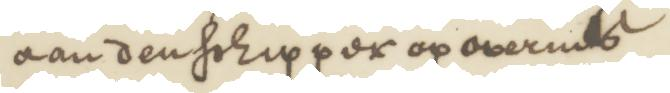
aan den schipper op overnes
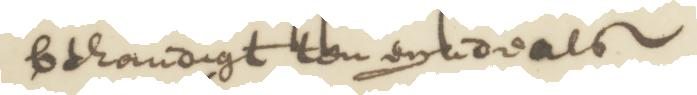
behandigt ten eynde als
